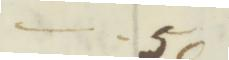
- - .50
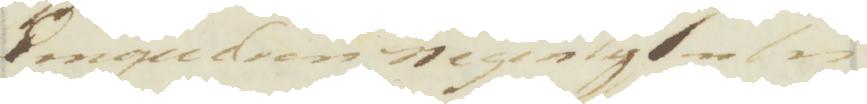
Een guldens negentig Cents
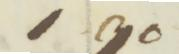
1. 90
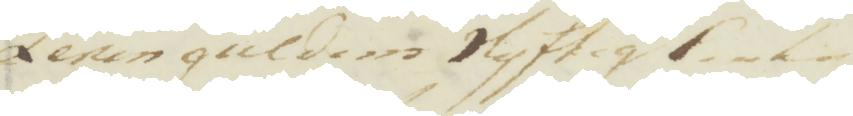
Zeven guldens Vijftig Cents
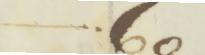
- .60
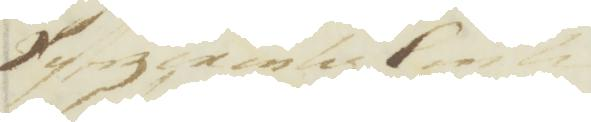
Vijf zeventig Cents
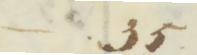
- .35
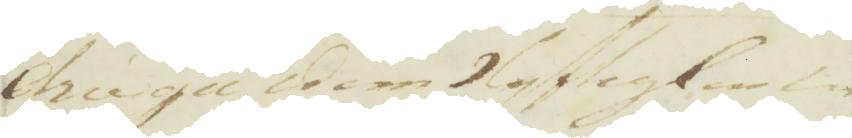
drie gulden Vijftig Cents
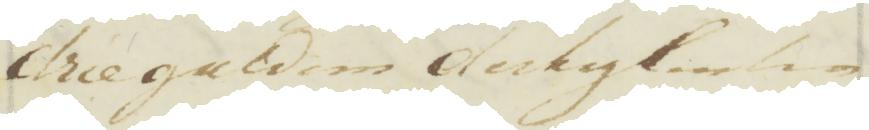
drie guldens dertig Cents
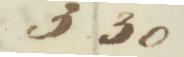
3. 30
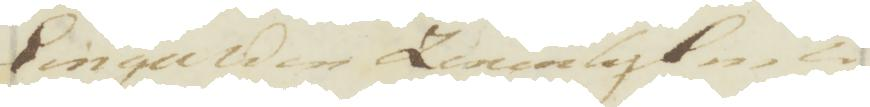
Een gulden Zeventig Cents
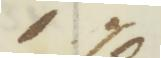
1. 70
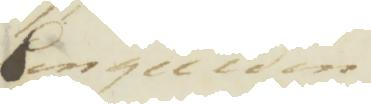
Een Guldens
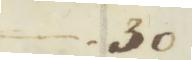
- .30
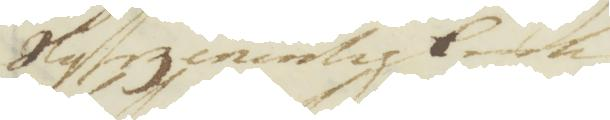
Vijfzeventig Cents
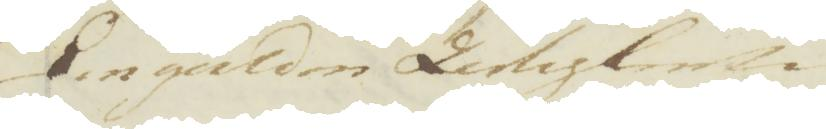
Een gulden Zestig Cents.
